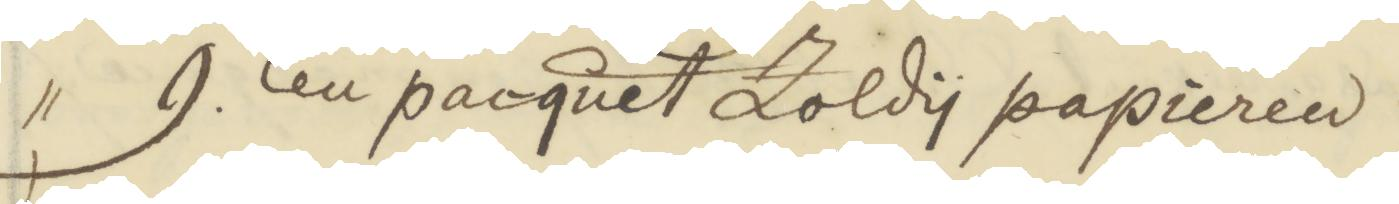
„ 9. Een pacquet zoldij papieren
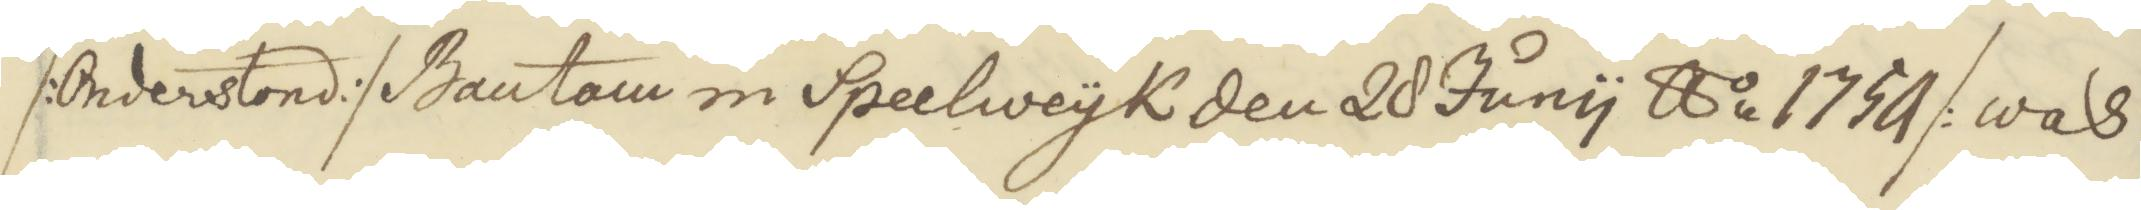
/:onderstond:/ Bantam in speelweijk den 28 Junij A„o 1754 /:was
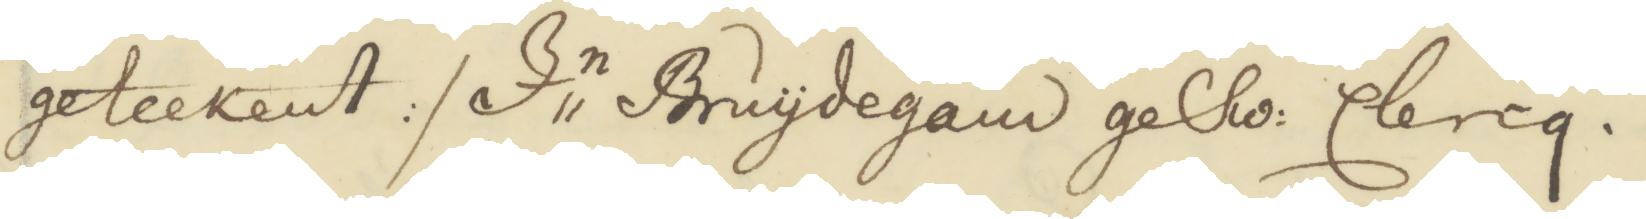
geteekent:/ J„n Bruijdegam gesw: Clercq.
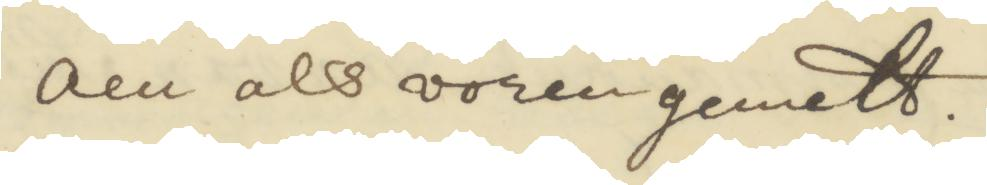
aen als voren gemelt.
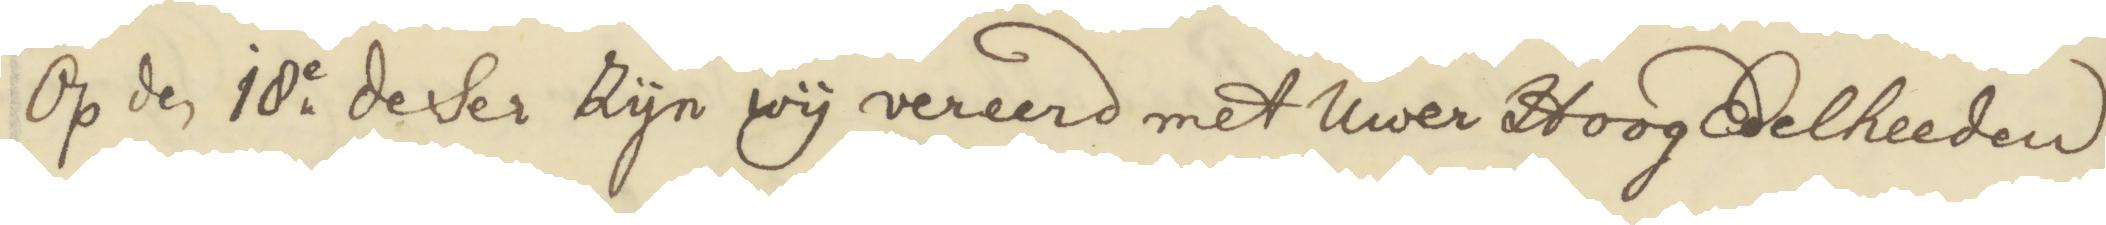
Op den 18„e deser zijn wij vereerd met uwer Hoog Edelheeden
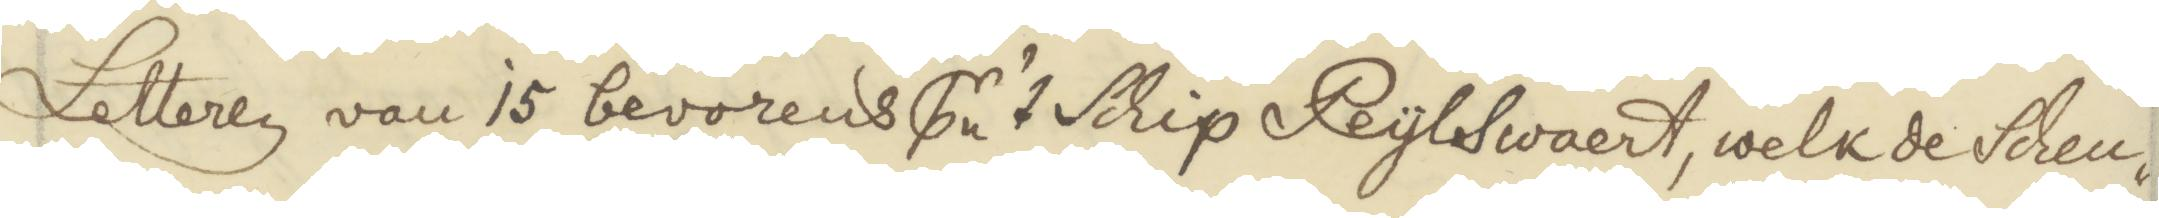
Letteren van 15 bevorens p„r ’t schip Peijlswaert, welk de schen„
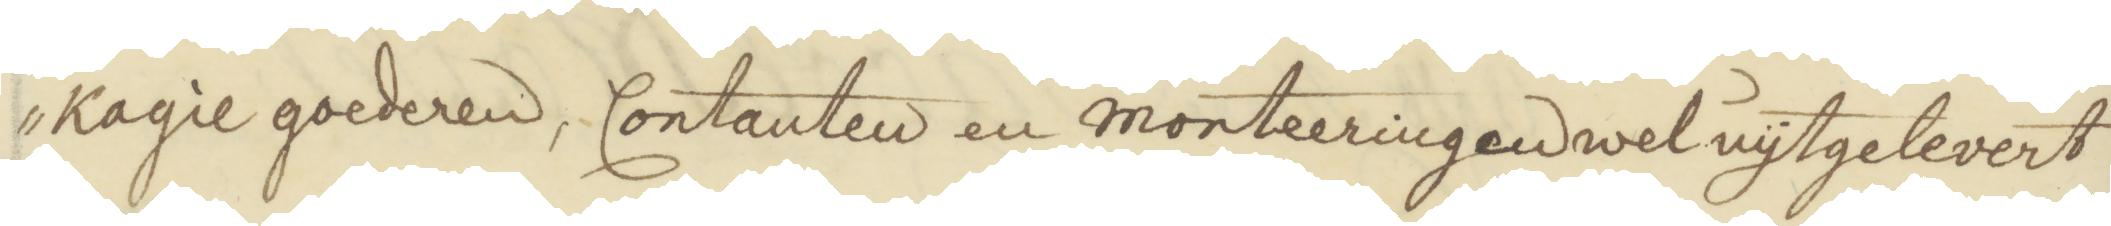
„kagie goederen, Contanten en morteeringen wel uijtgelevert
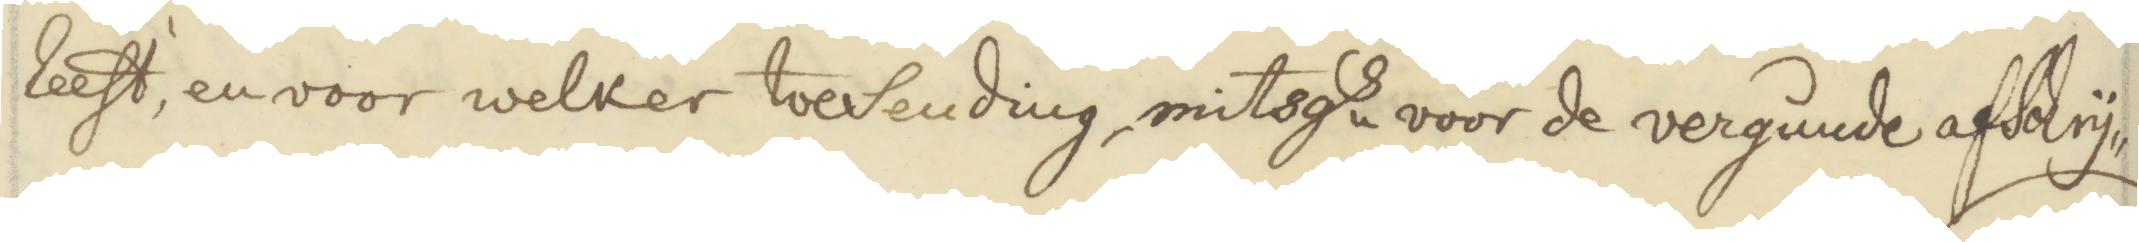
heeft, en voor welker toesending, mitsg„s voor de vergunde afschrij„
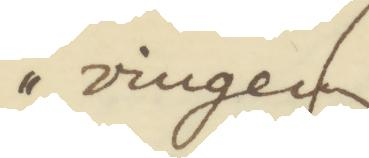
„vingen
